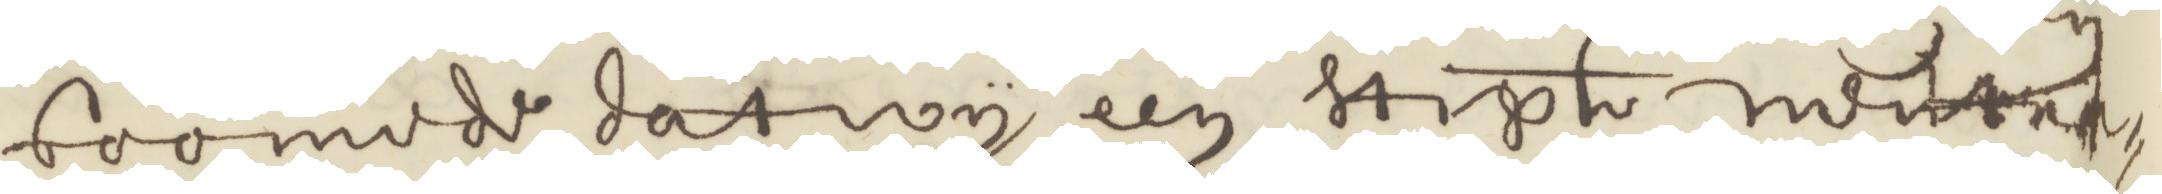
soomede dat wij een stipte neutra„
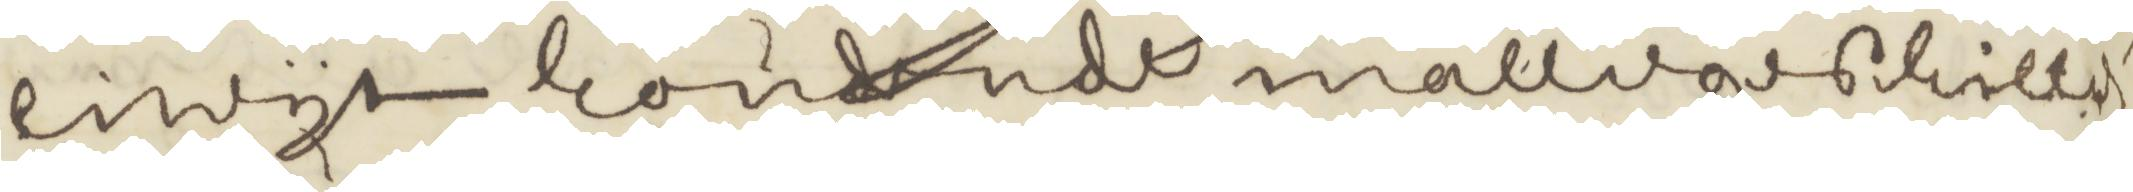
liteijt houdende in alle geschillen
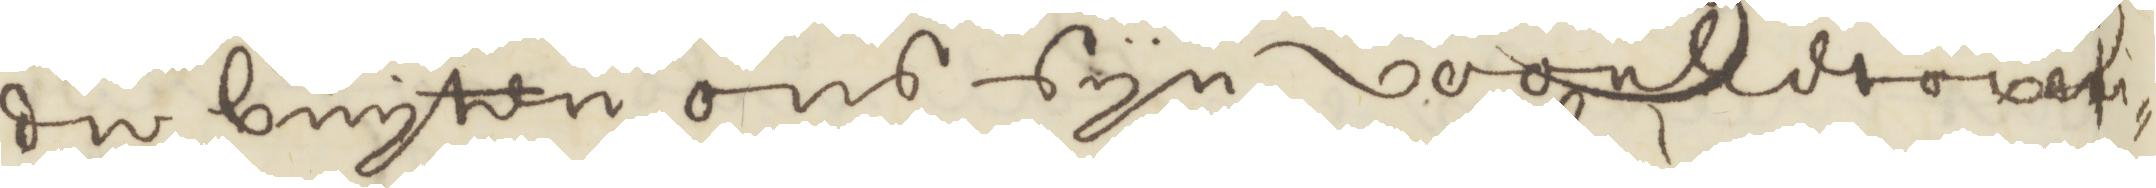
die buijten ons sijn voor het overi„
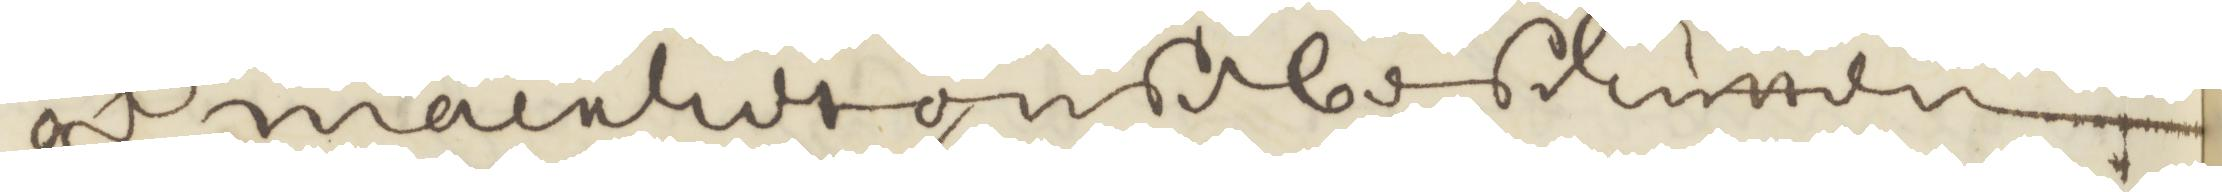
ge maer het onse beschutten
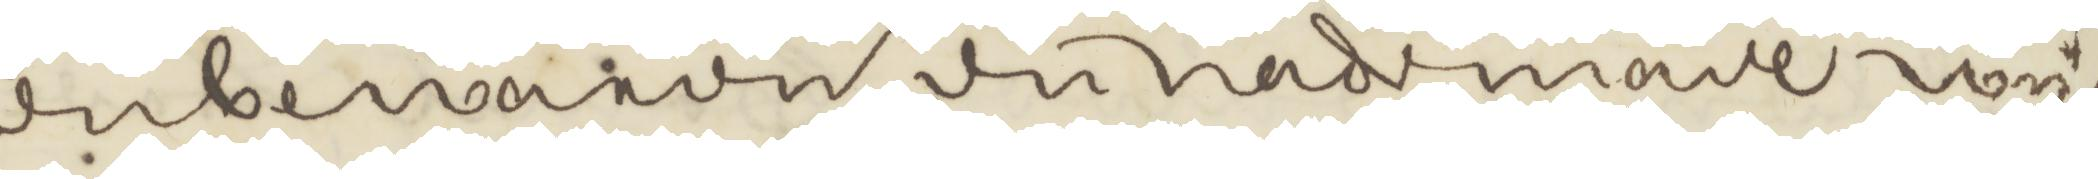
en bewaren en nademael wij
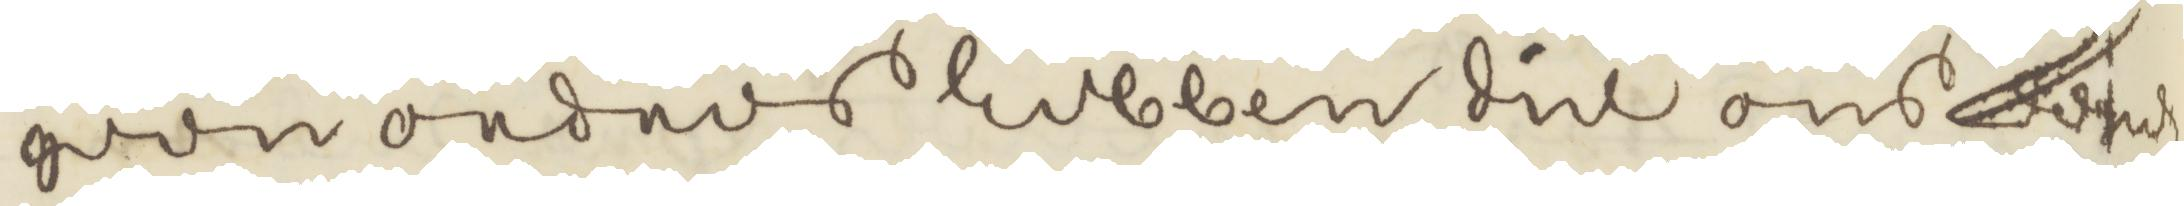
geen ordres hebben die ons Eenen
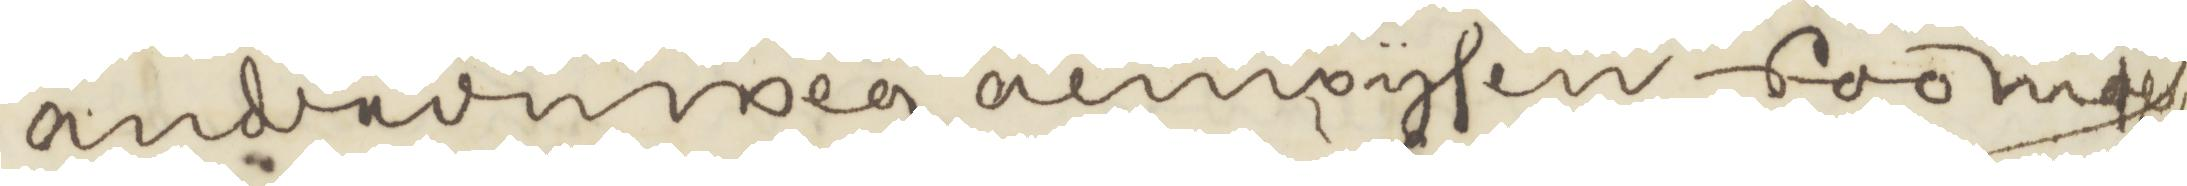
anderen weg aenwijsen soo moe
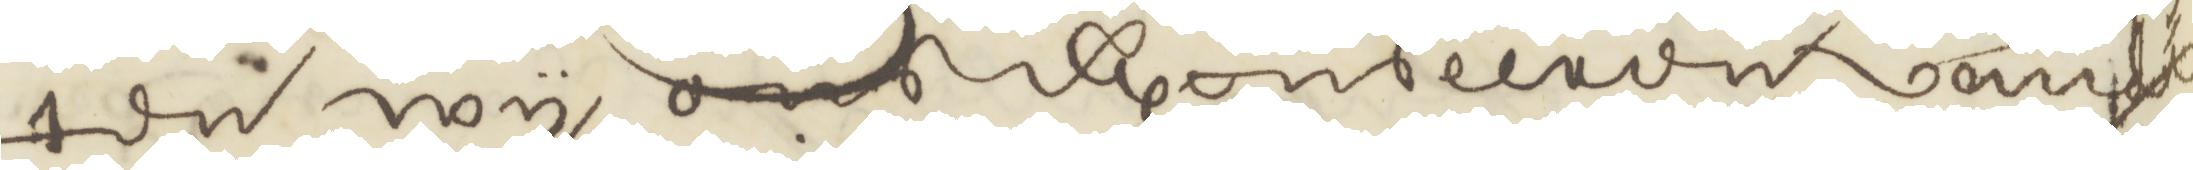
ten wij ons Excuseeren vande
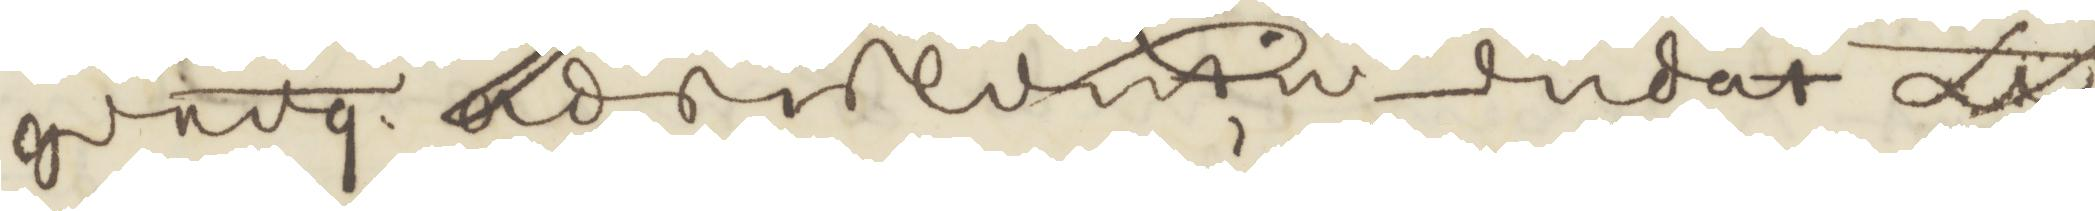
gereq: adsistentie en dat te
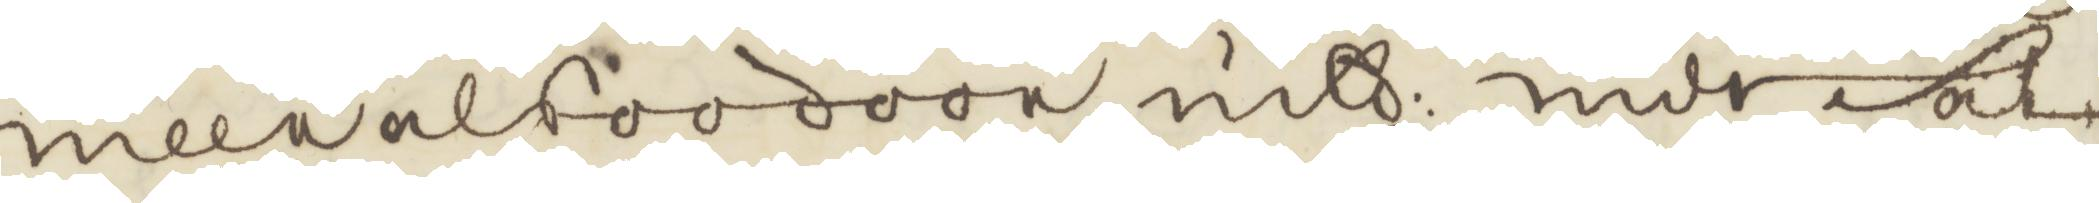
meer alsoo door uEd: niet sal
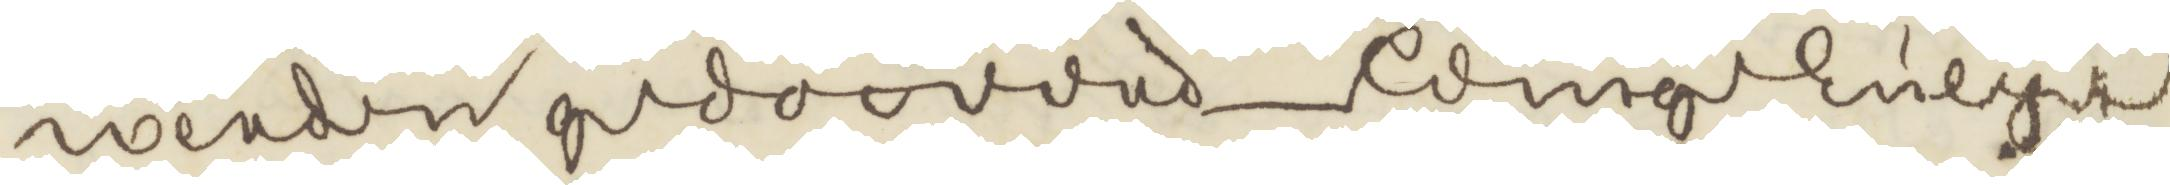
werden gedoceerd Eenige hulpe
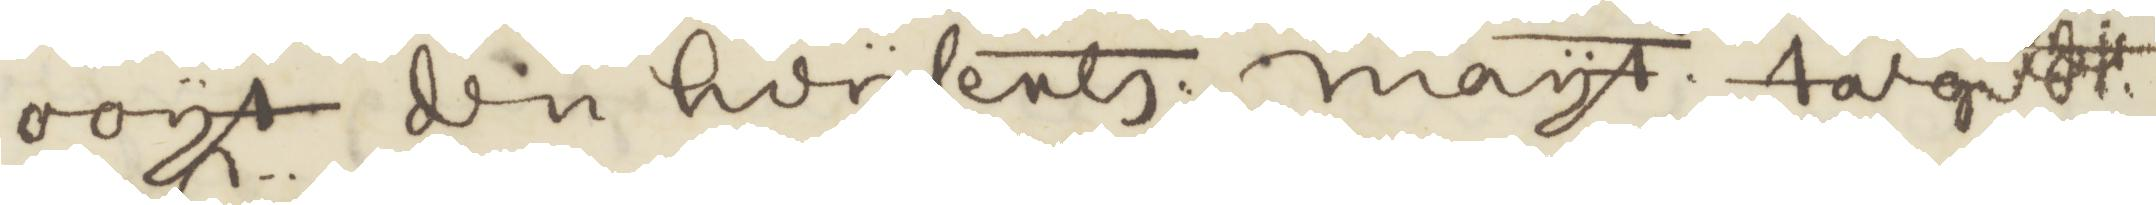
ooijt den keijserlijk maijt. toeged:t
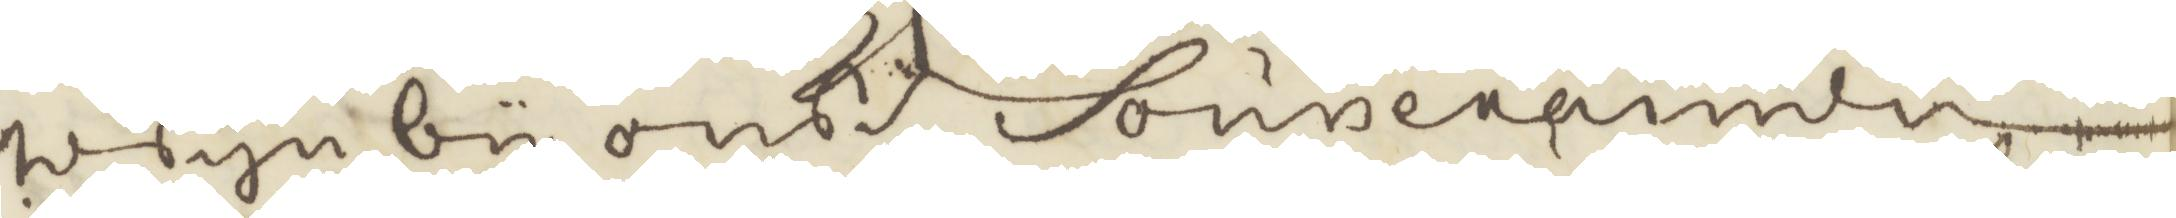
te sijn bij onse souverainen
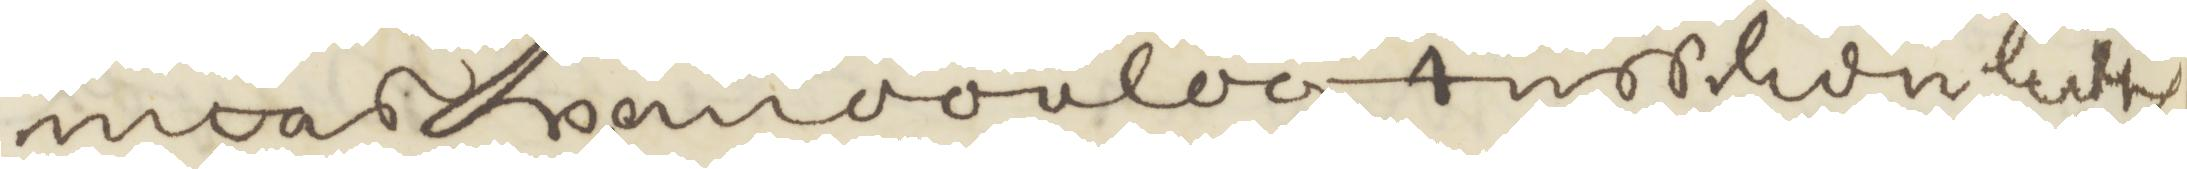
in cas van oorlog tusschen het
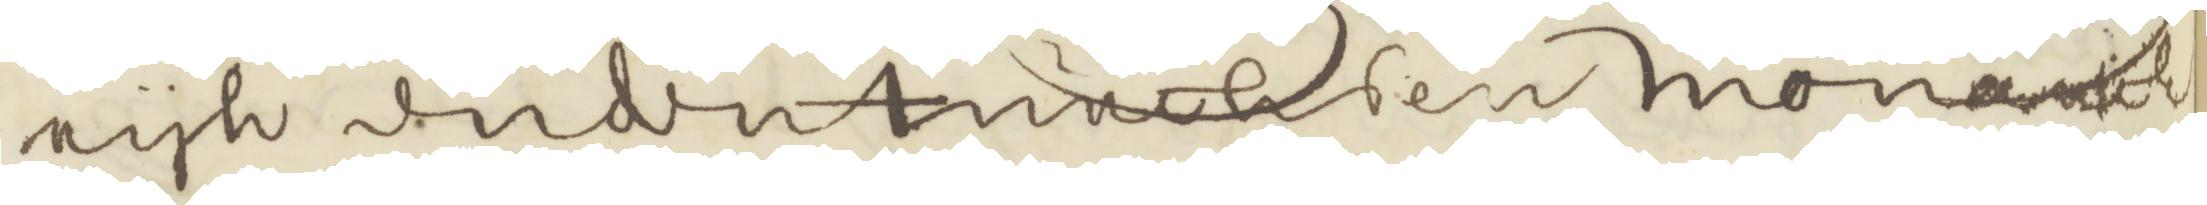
rijk en den turcksen Monarch
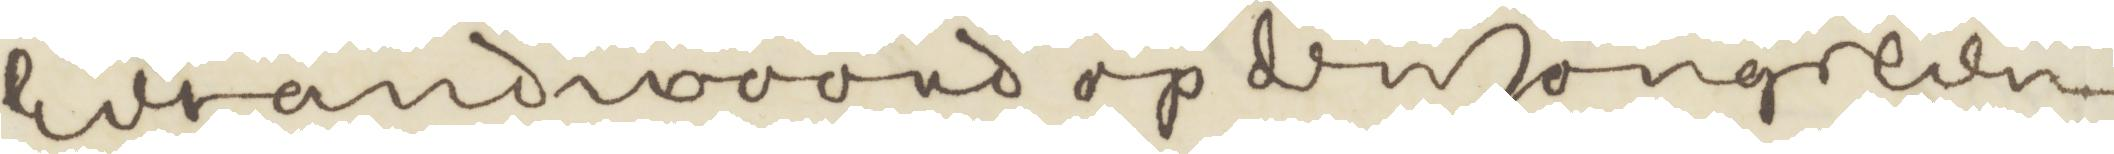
het andwoord op den Jongsten
